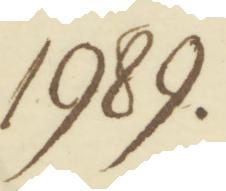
1989.
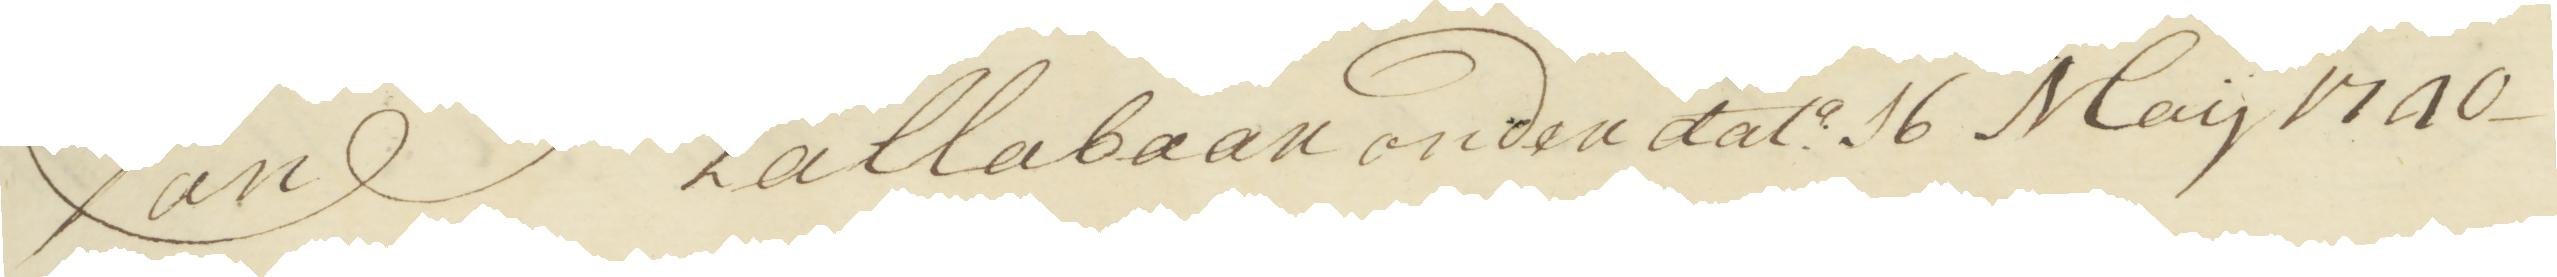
Van Mallabaar onder dat:o 16 Maij 1740
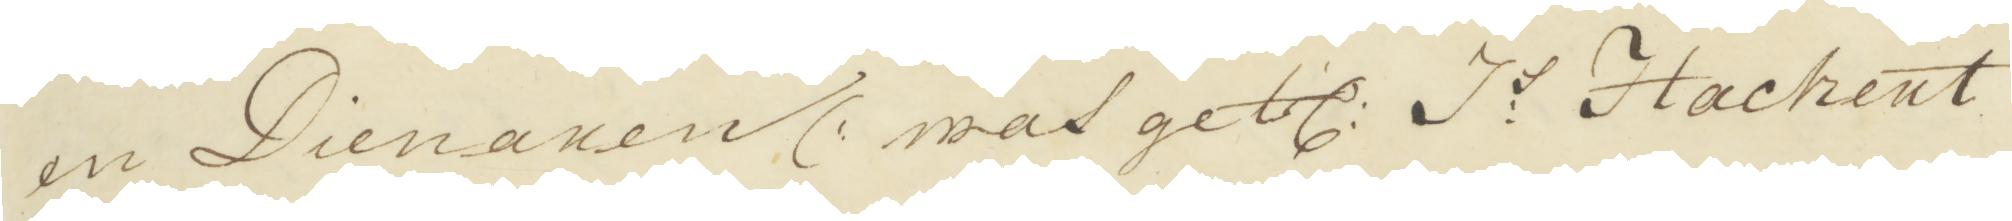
en Dienaren (:was getec: I:s Hackert
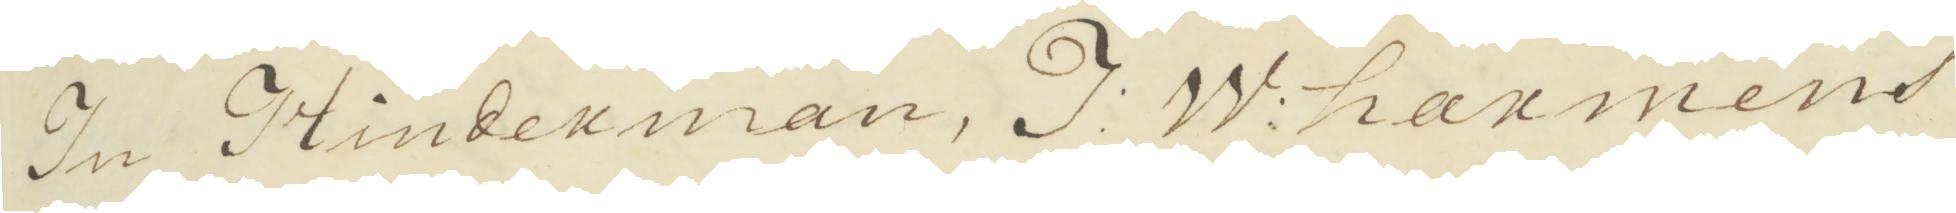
In Hinderman, I: W: harmens
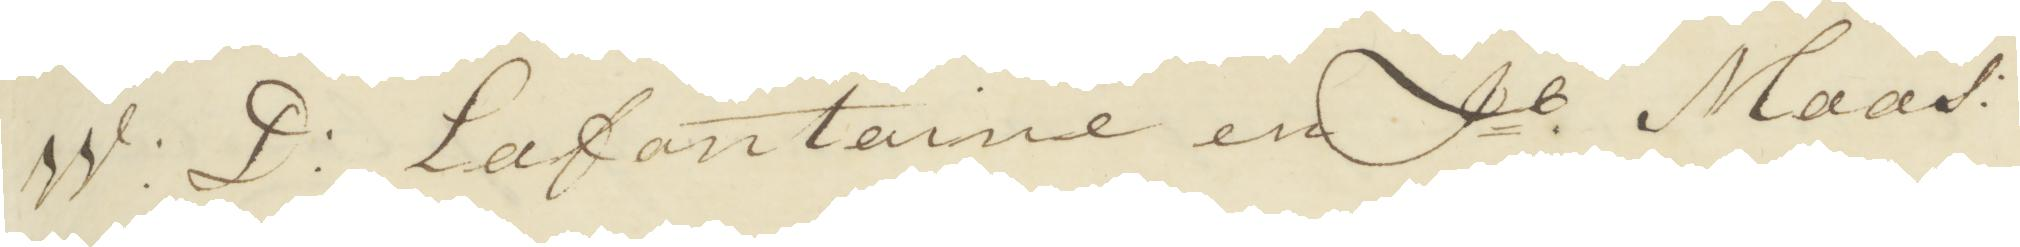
W: D: Lafontaine en P=l Maas:
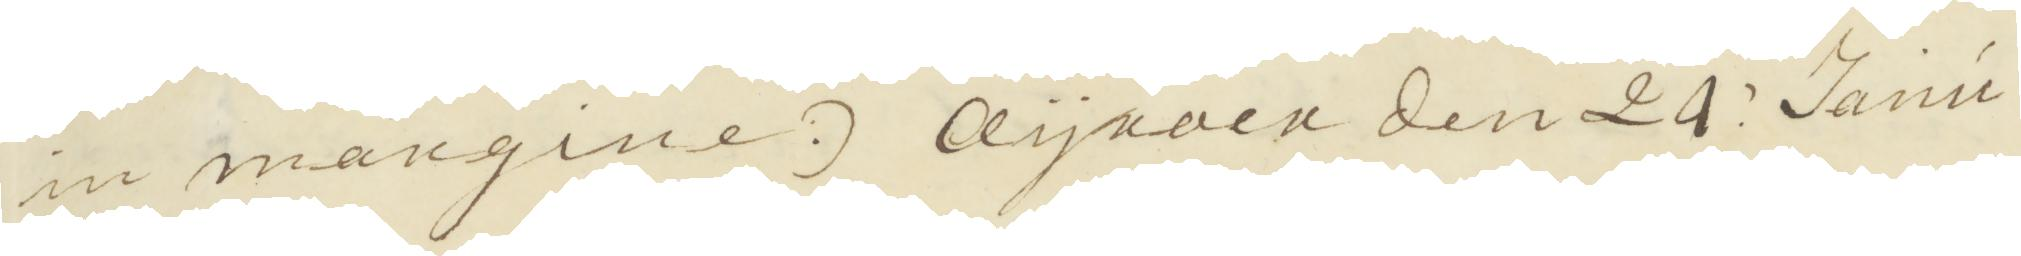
in margine:) aijraer den 24.' Ianu
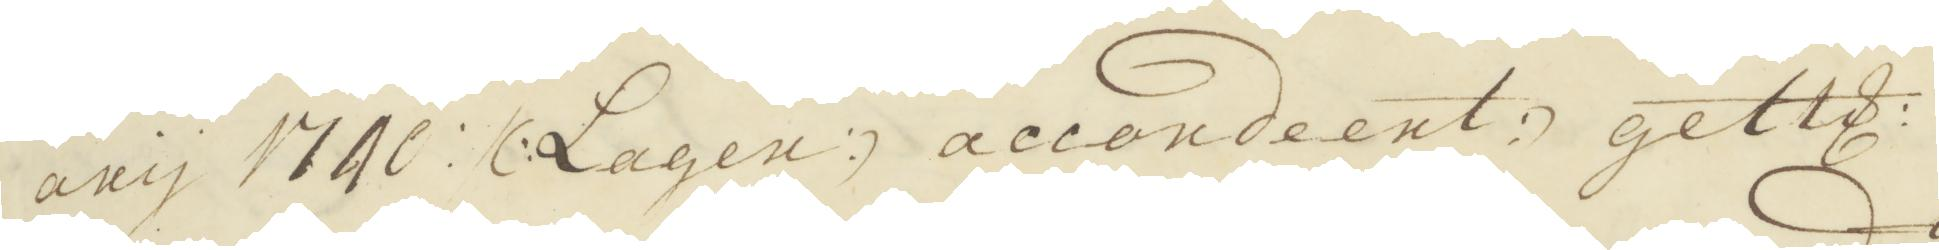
arij 1740: (:Lager:) accordeert:) gettver:
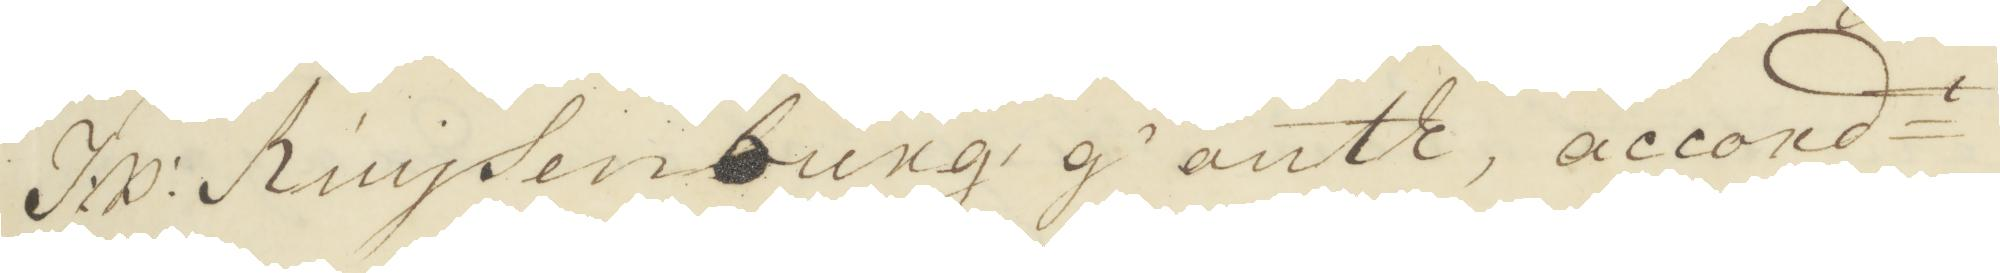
I: W: Ruijsenburg g’auth, accord=t
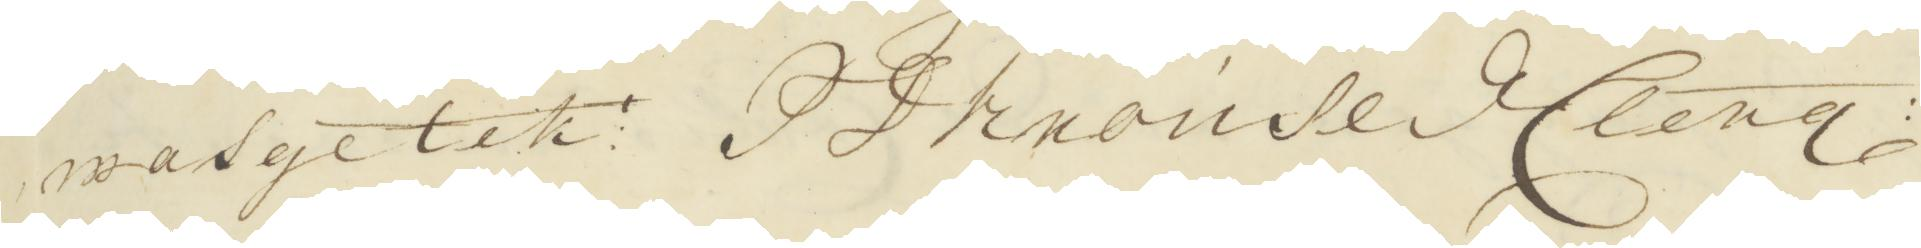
was getek:t P D krouse d'Clerq:
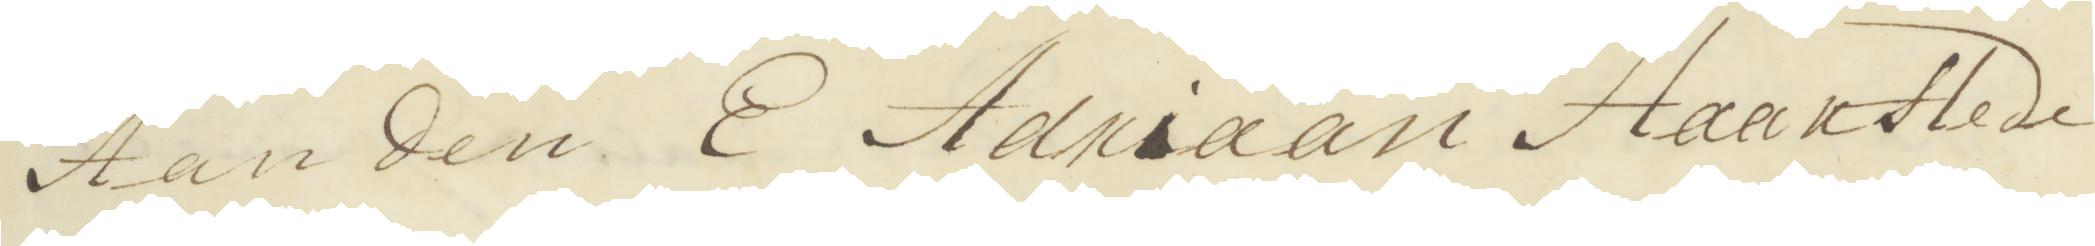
Aan den E Adriaan Haarstede
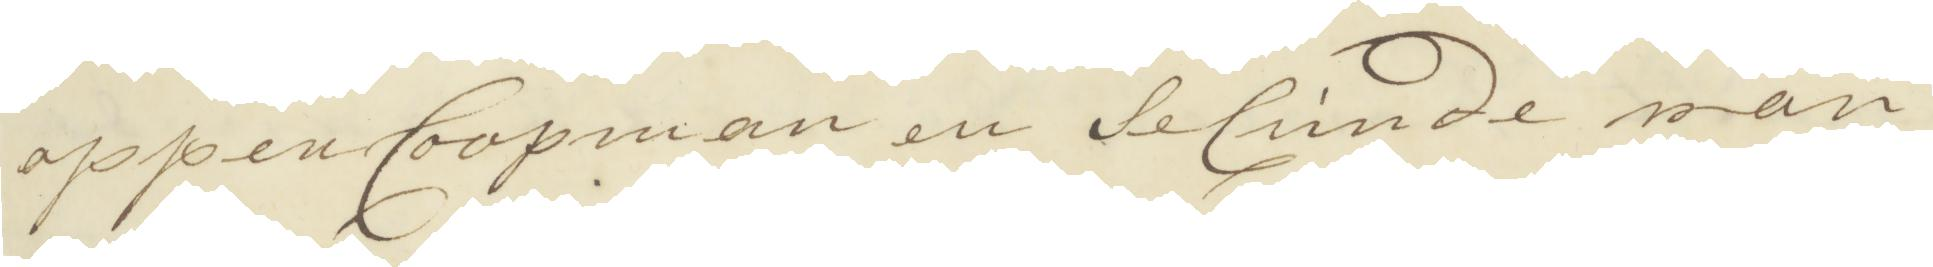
oppercoopman en secunde van
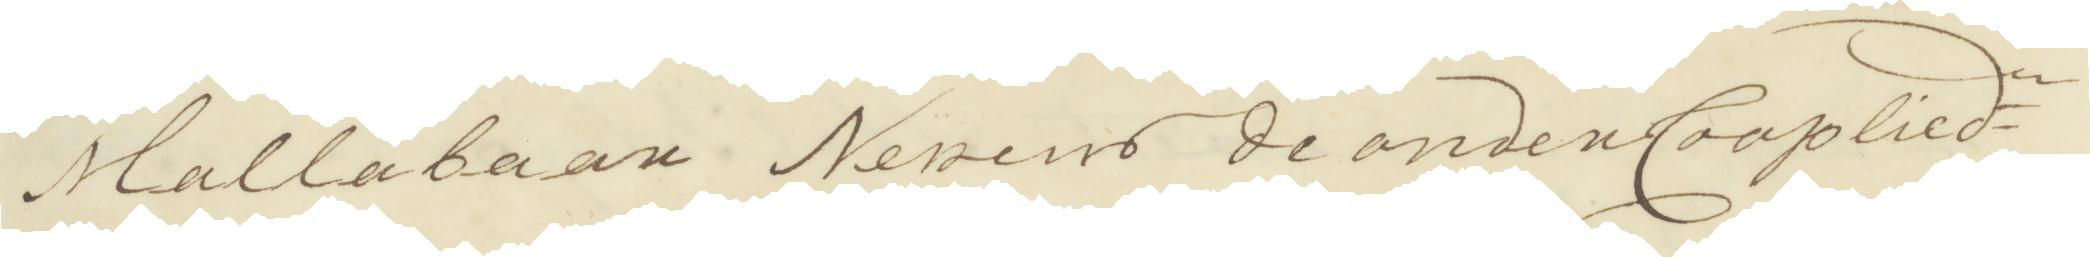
Mallabaar Nevens de ondercooplied=n
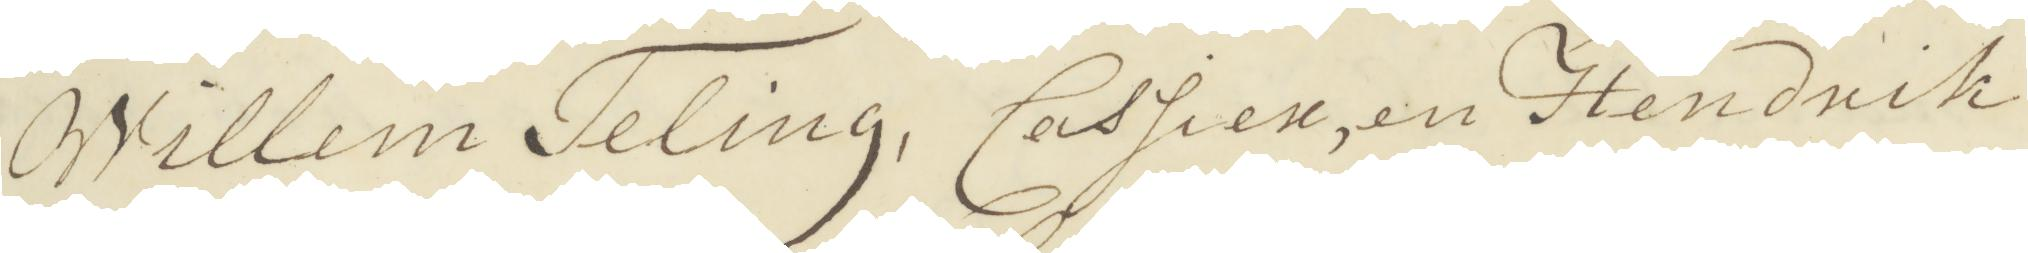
Willem Teling, Cassier, en Hendrik
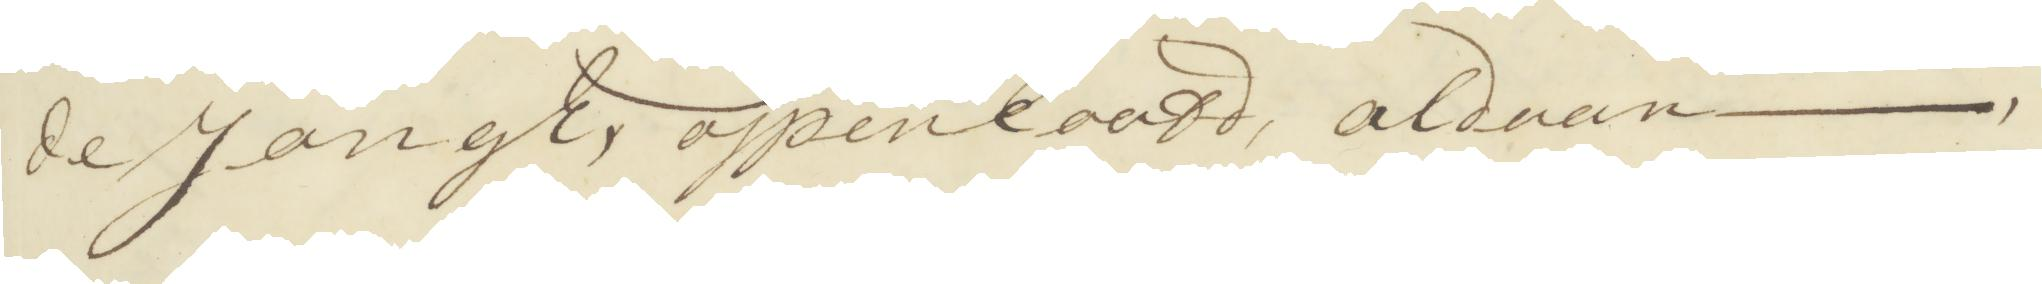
de Jongh, opperhoofd, aldaar—,
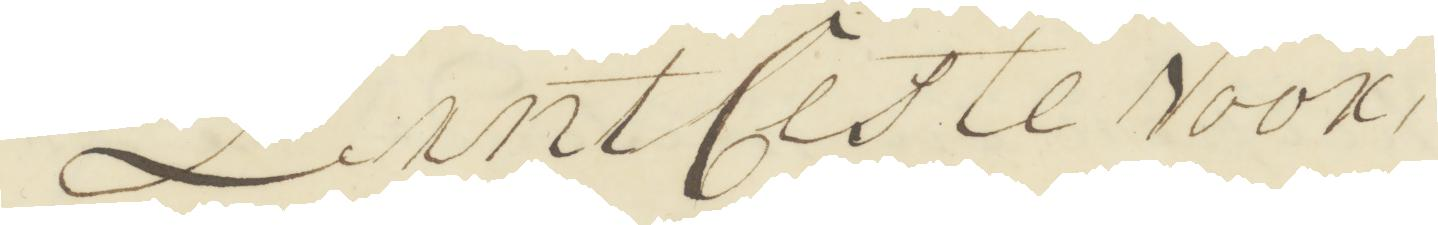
Erntfeste voor,
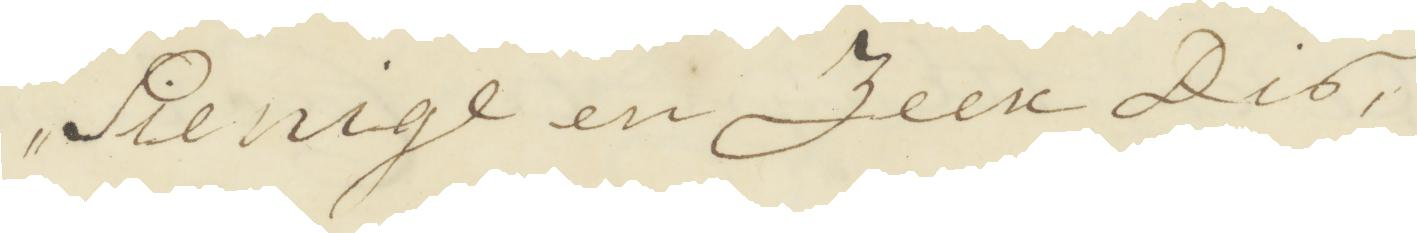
„sienige en zeer Dis,
